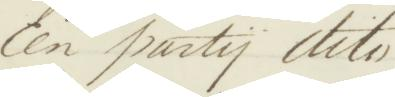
Een partij dito
